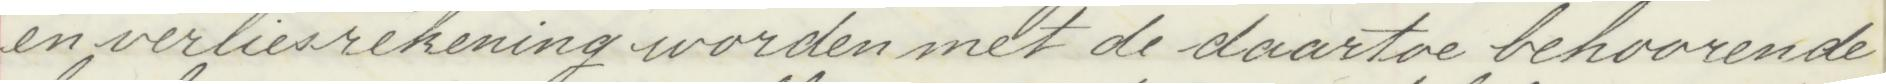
en verliesrekening worden met de daartoe behoorende
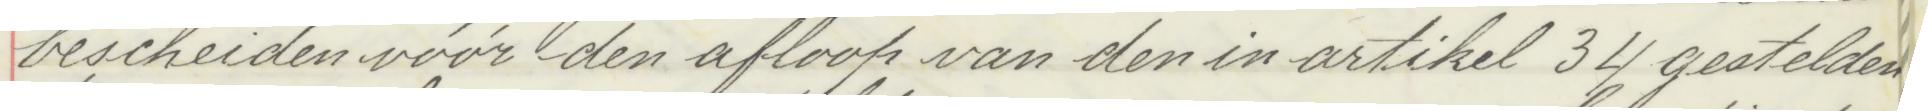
bescheiden vóór den afloop van den in artikel 34 gestelden
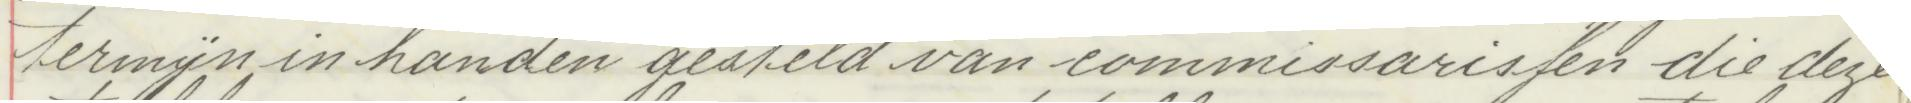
termijn in handen gesteld van commissarissen die deze
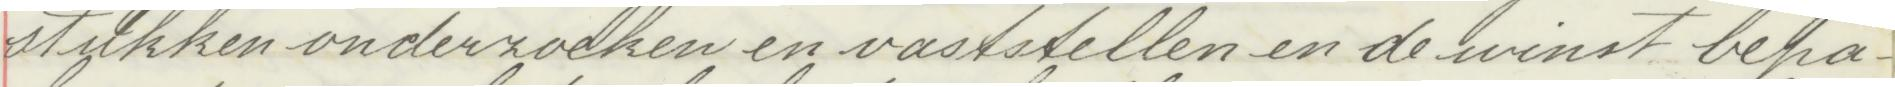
stukken onderzoeken en vaststellen en de winst bepa-
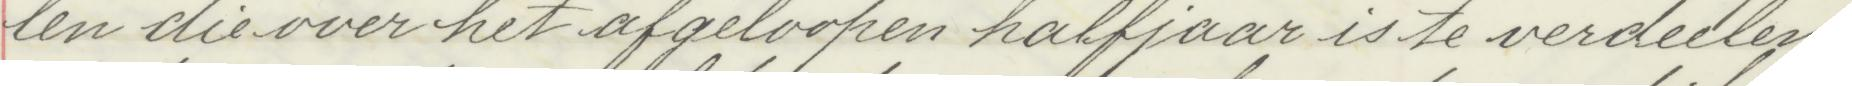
len die over het afgeloopen halfjaar is te verdeelen
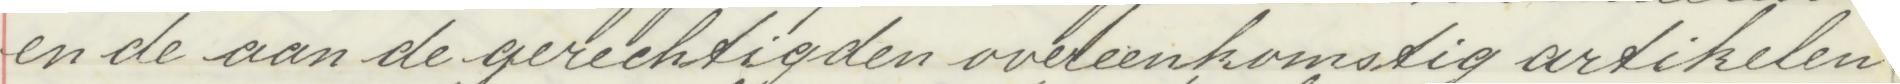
en de aan de gerechtigden overeenkomstig artikelen
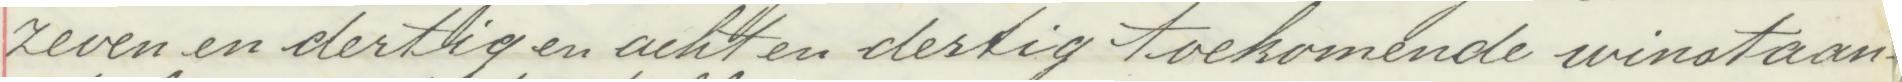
zeven en dertig en acht en dertig toekomende winstaan-
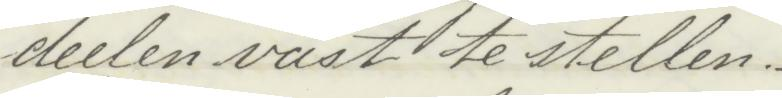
deelen vast te stellen.
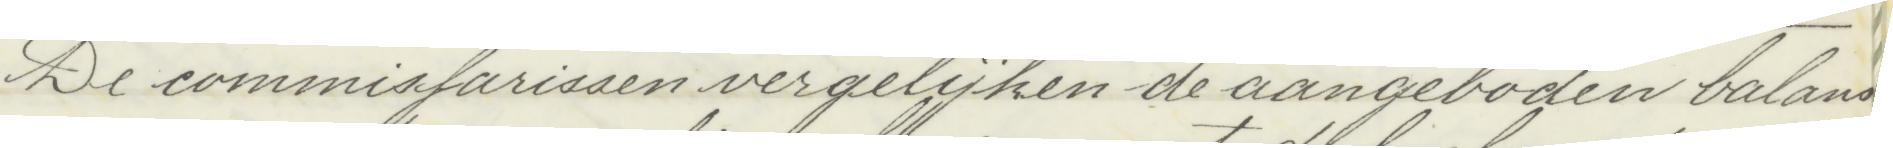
De commissarissen vergelijken de aangeboden balans
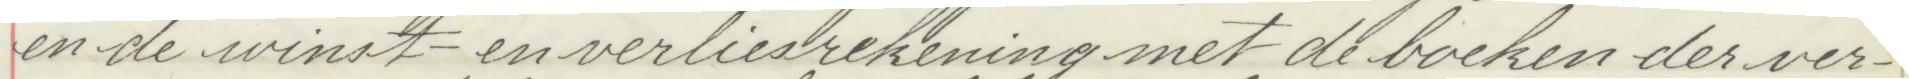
en de winst- en verliesrekening met de boeken der ver-
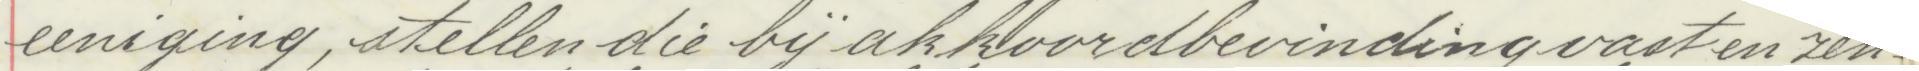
eeniging, stellen die bij akkoordbevinding vast en zen-
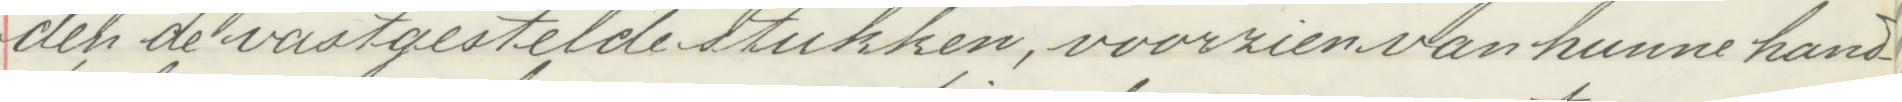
den de vastgestelde stukken, voorzien van hunne hand-
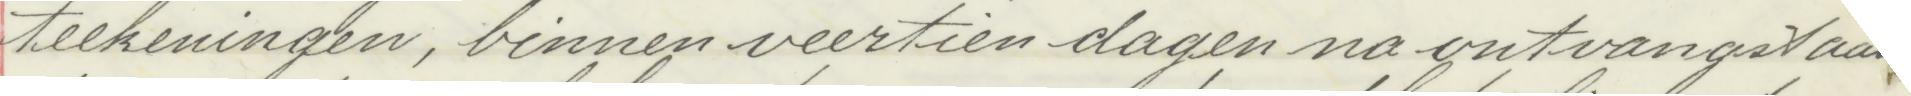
teekeningen, binnen veertien dagen na ontvangst aan
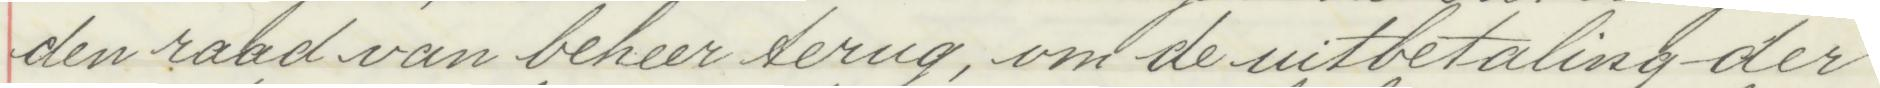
den raad van beheer terug, om de uitbetaling der
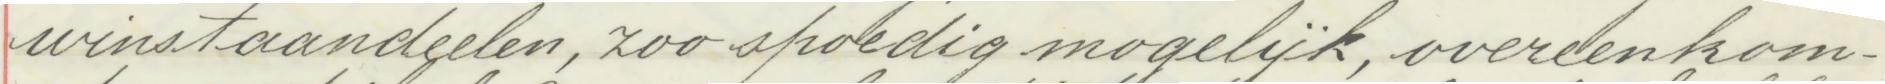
winstaandeelen, zoo spoedig mogelijk, overeenkom-
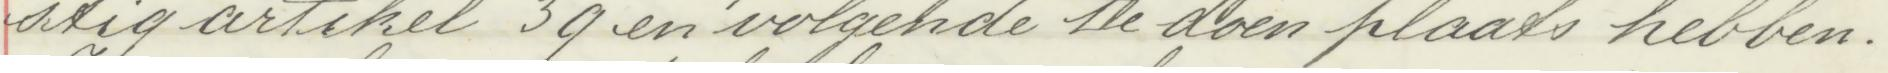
stig artikel 39. en volgende te doen plaats hebben.
